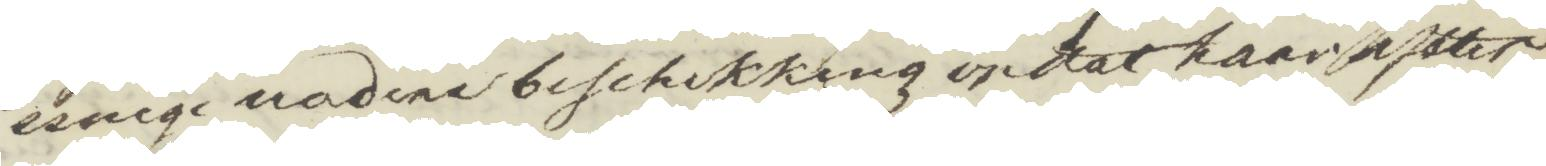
eenige nadere beschikking op dat haar afster
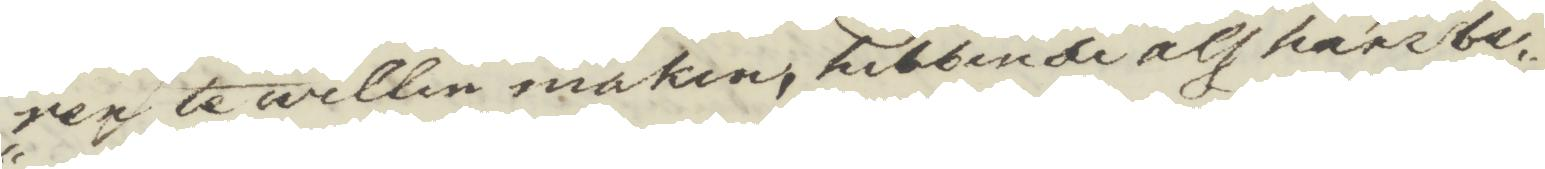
„ven te willen maken, hebbende als haar be„
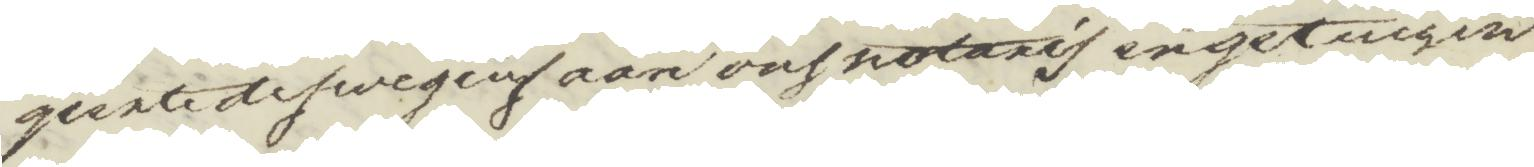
geerte deswegens aan ons notaris en getuigen
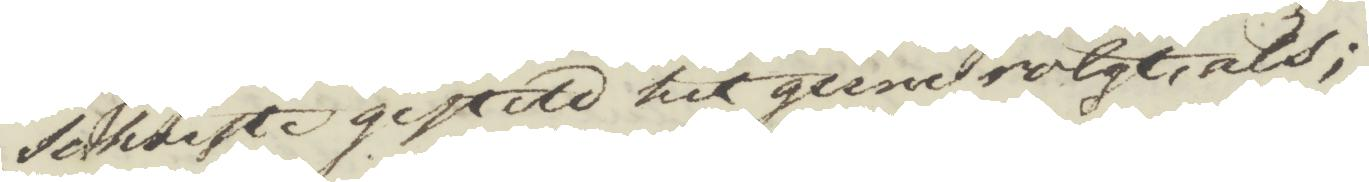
schrifte gesteld het geene volgt, als;
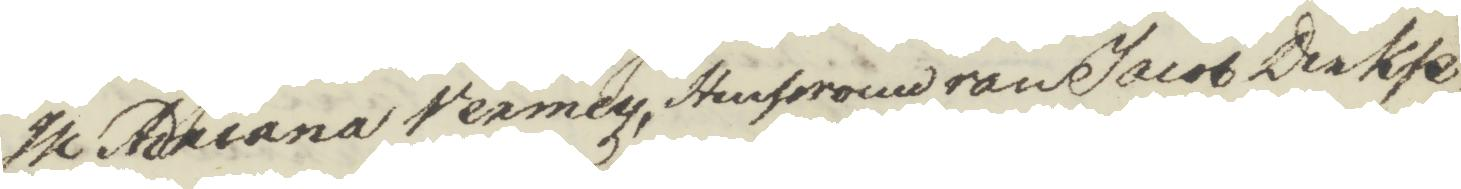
Jk Adriana Vermey, Huisvrouw van Jacob Derkse
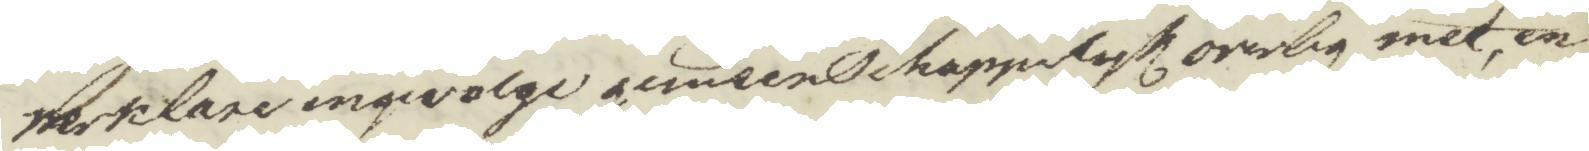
verklare ingevolge gemeenschappelijk overleg met, en
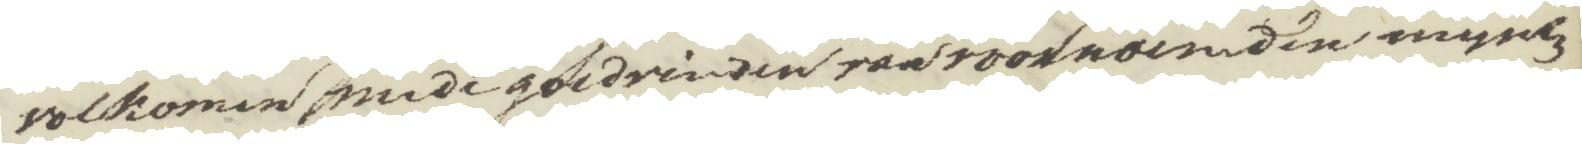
volkomen mede goedvinden van voornoemden mynen
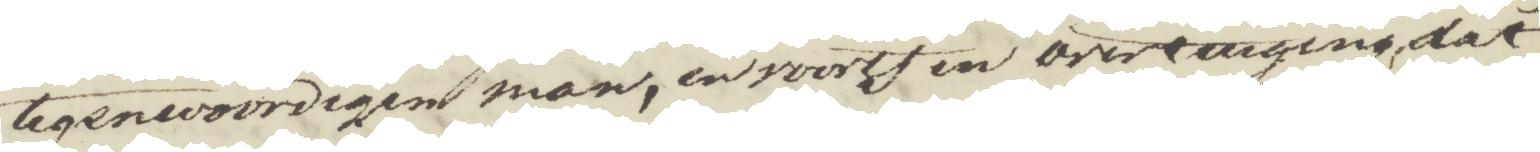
tegenwoordigen man, en voorts in overtuiging, dat
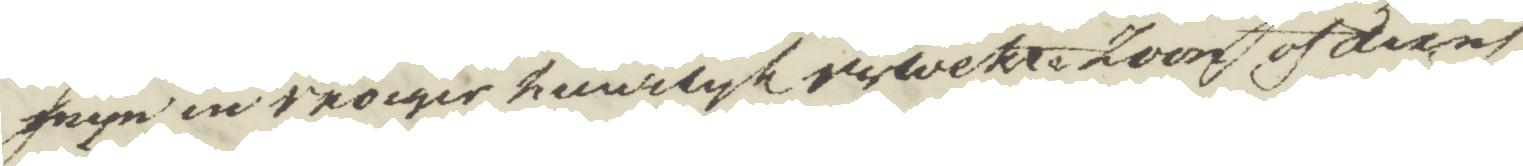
myn in vroeger huwelyk verwekte zoon of diens
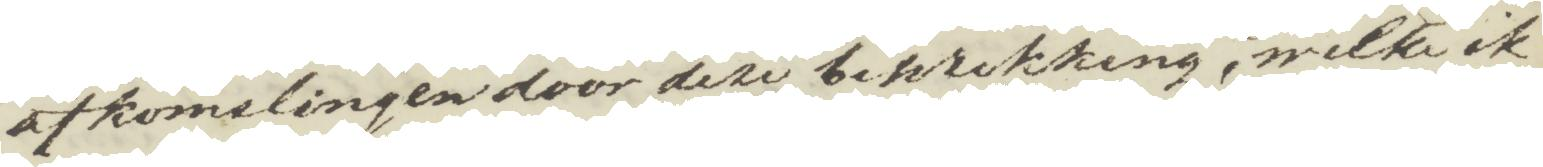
afkomelingen door deze beschikking, welke ik
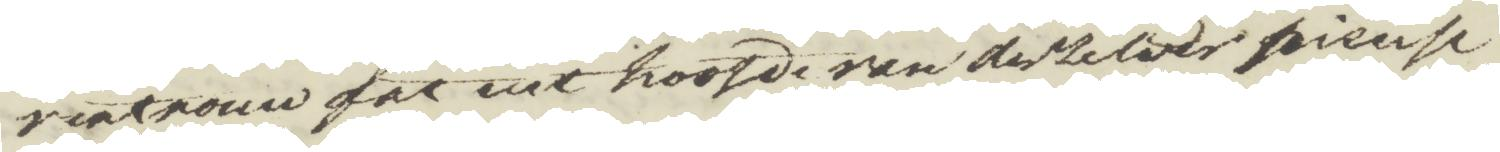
via trouw dat uit hoofde van der zelver piense
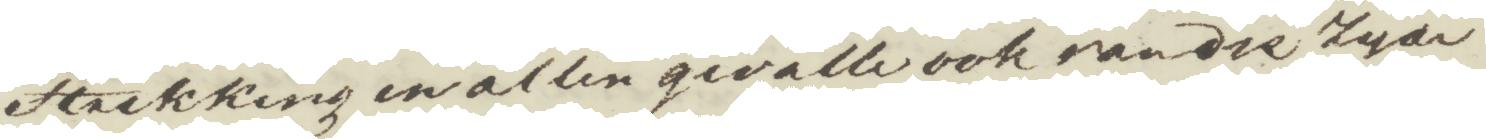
strekking in allen gevalle ook van die zyde
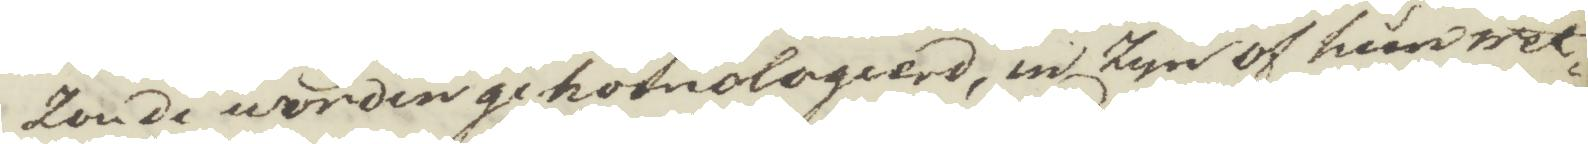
zoude worden gehomologeerd, in zyn of hun wet„
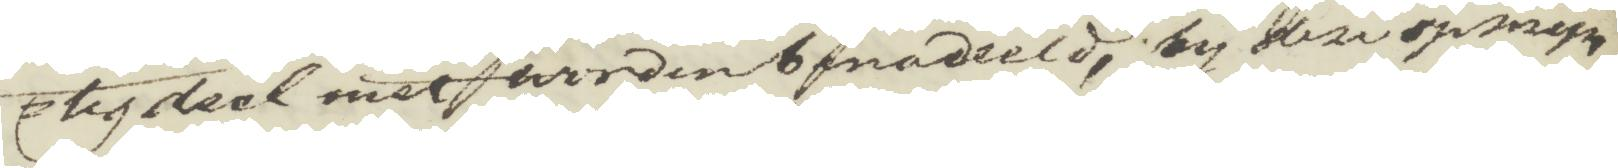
=tig deel niet worden benadeeld, by deze op myn
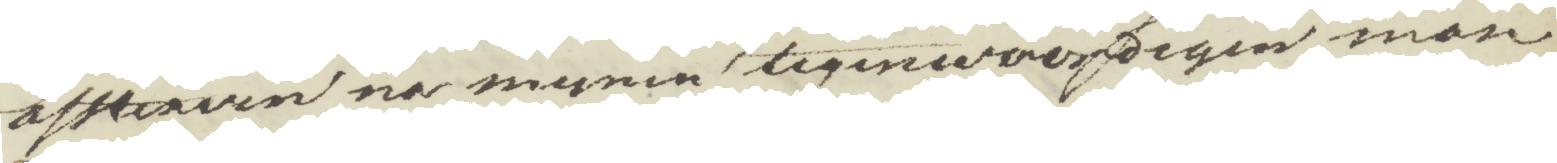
afsterven na mynen tegenwoordigen man
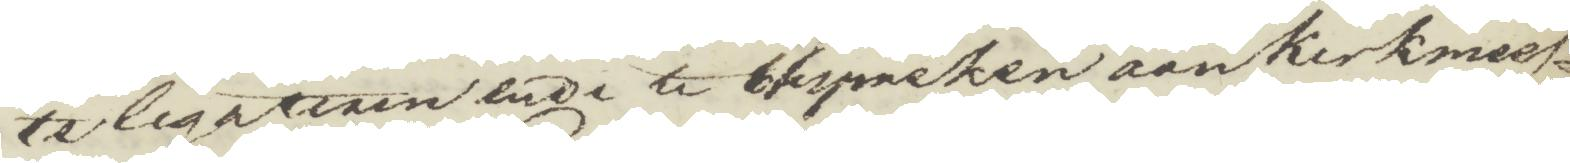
te legateren ende te bespreken aan kerkmees
